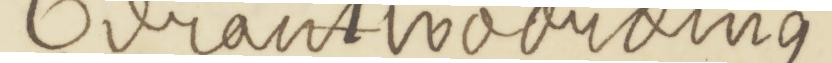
verantwoording
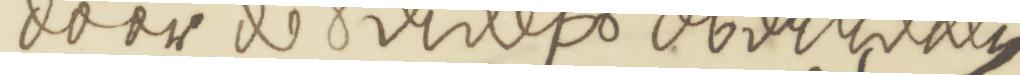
door de scheeps overheden
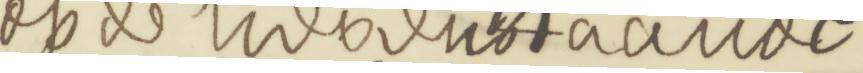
op de nevenstaande
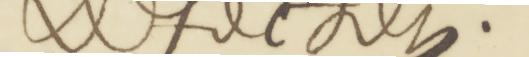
Defecten.
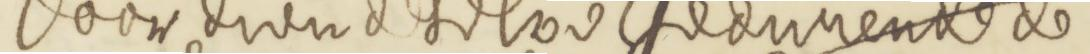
Door dien deselve Gedurende de
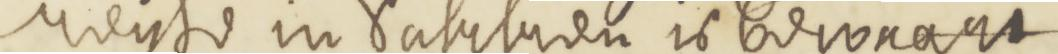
reijse in Sakken is bewaart
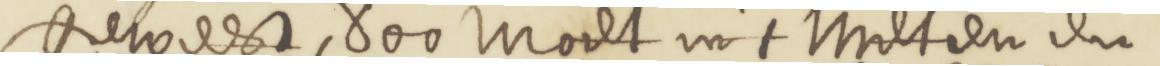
geweest, Soo moet in ’t Meten en
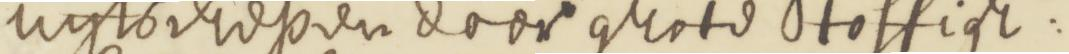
uijtschepen door grote Stoffigh:t
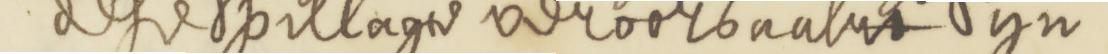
dese Spillagie veroorsaakt Sijn
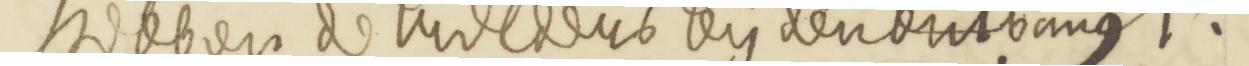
Hebben de kelders bij den ontvang 1.
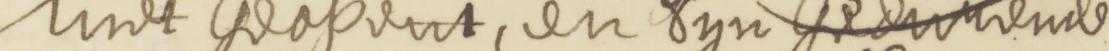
niet geopent, en sijn gedurende
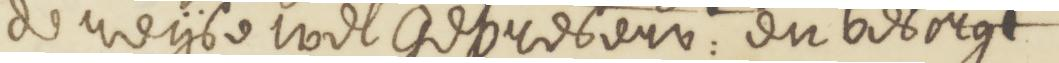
de reijse wel gepreserv:t en besorgt
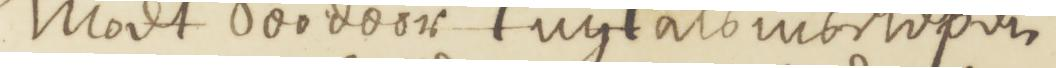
moet Soo door ’t uijt als inschepen
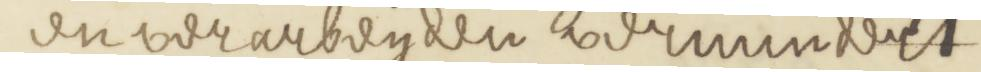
en verarbeijden vermindert
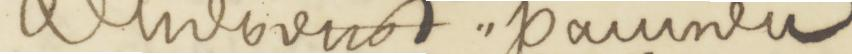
de nevenst:e pannen
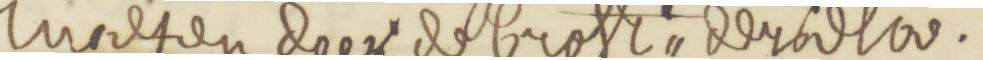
moeten door de brosh„t derselve.
